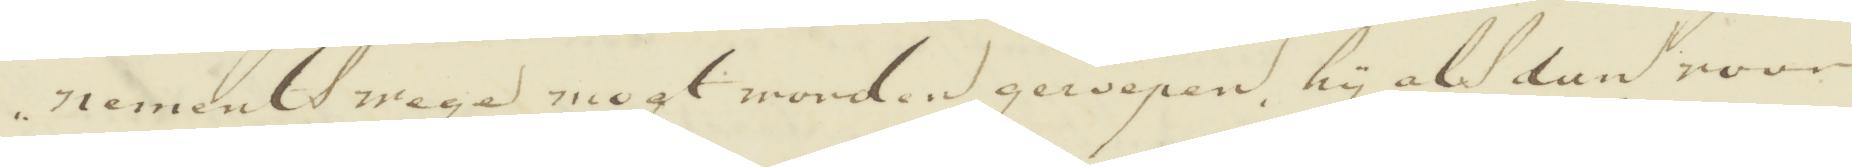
„nements wege mogt worden geroepen, hij als dan voor
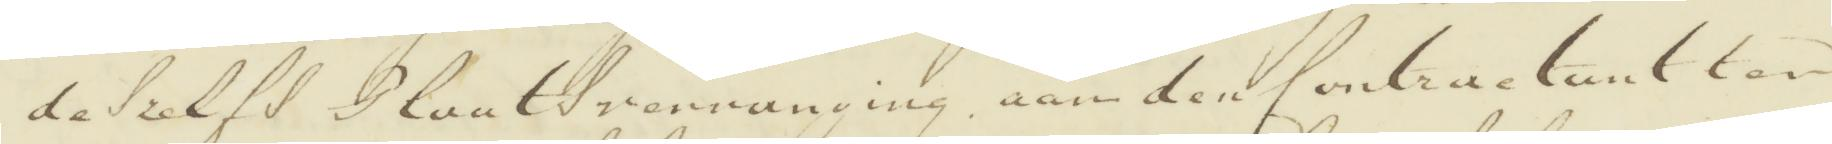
deszelfs Plaats vervanging, aan den Contractant ten
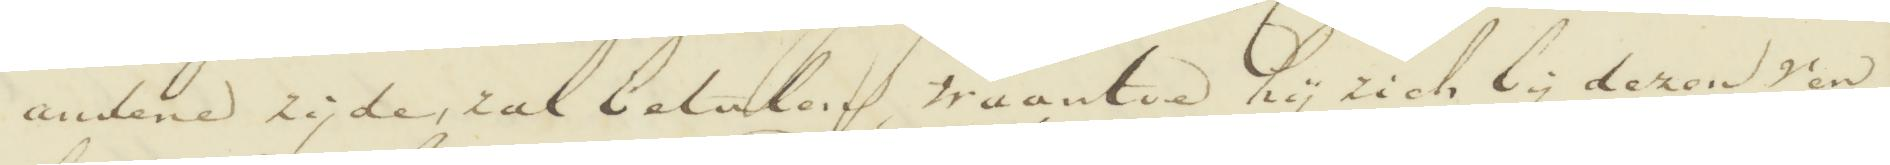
andere zijde, zal betalen, waartoe hij zich bij dezen ver
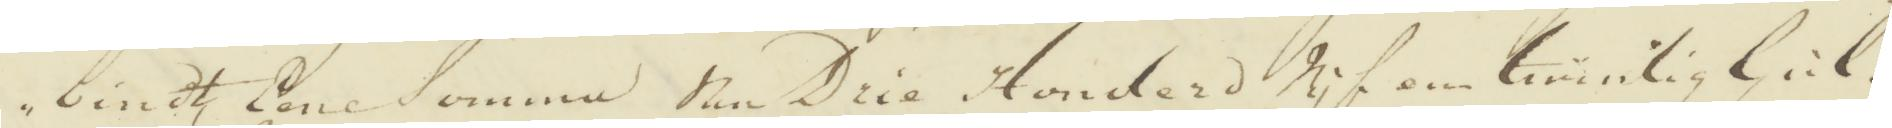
„bindt Eene somma van Drie Honderd Vijf en twintig Gul„
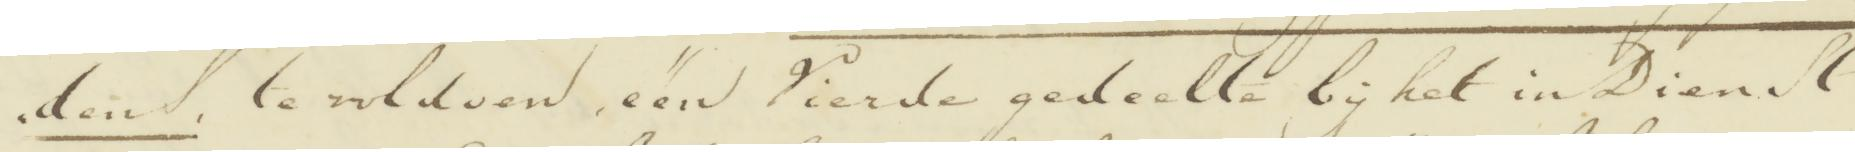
„dens te voldoen een Vierde gedeelte bij het in Dienst
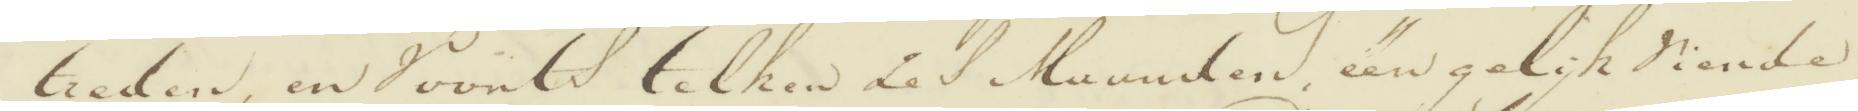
treden, en Voorts telken zes Maanden, één gelijk Vierde
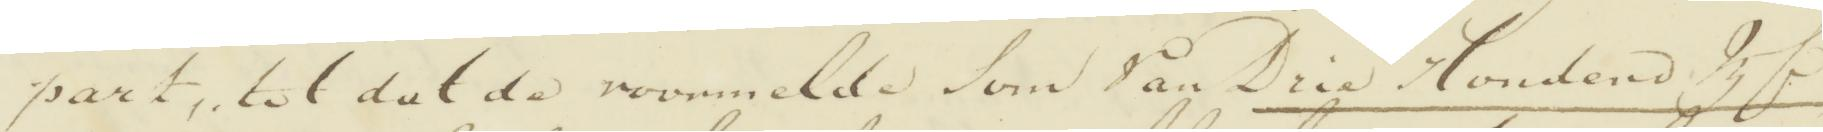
part„ tot dat de voormelde som van Drie Honderd Vijf
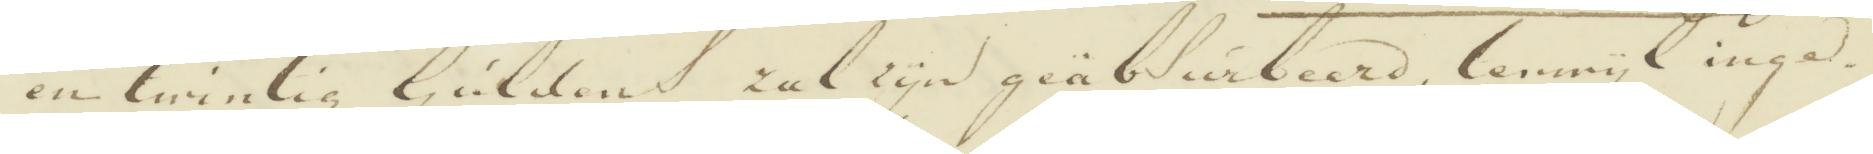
en twintig Guldens. zal zijn geäbsurbeerd, terwijl inge„
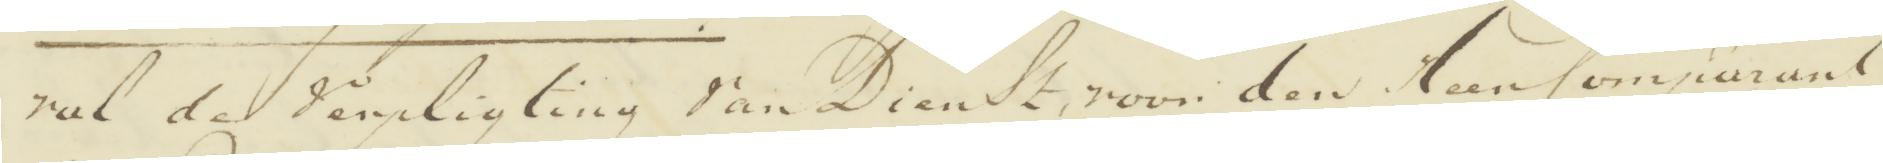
val de verpligting van Dienst voor den Heer Comparant
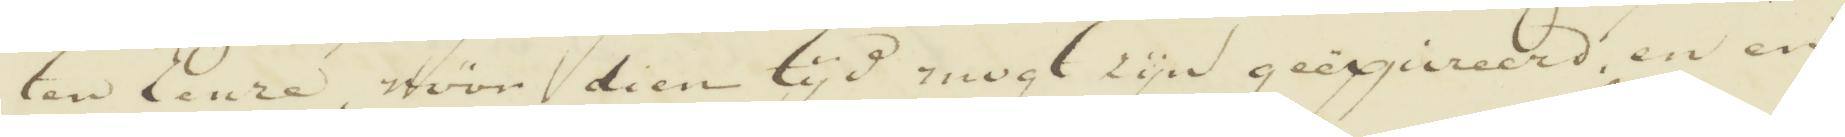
ten Eenre, vóór dien tijd mogt zijn geëxpireerd, en en
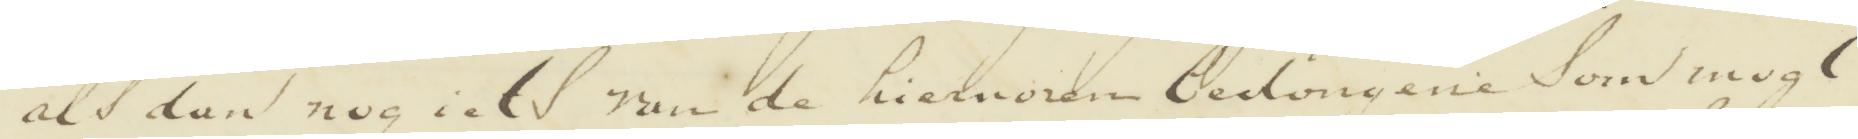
als dan nog iets van de hiervoren bedongene som mogt
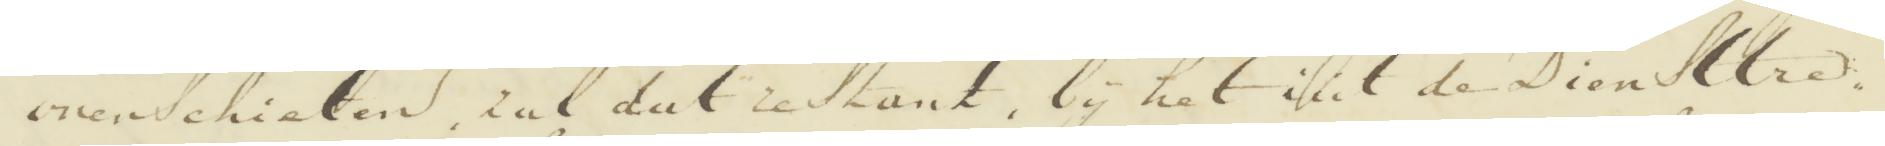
overschieten, zal dat restant, bij het uit de Diensttre„
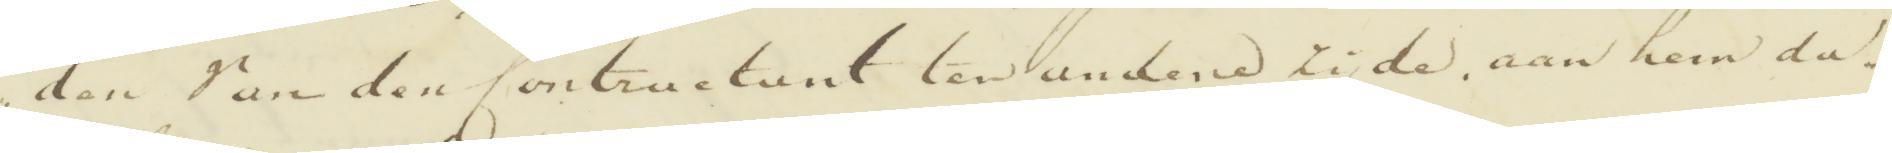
„den van den Contractant ten andere zijde, aan hem da„
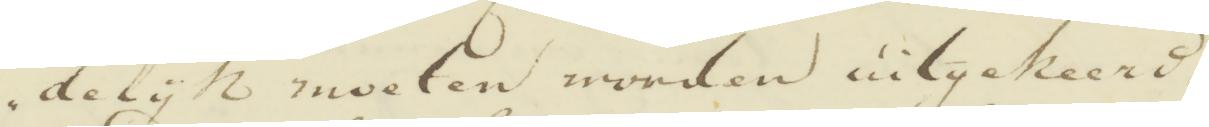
„delijk moeten worden uitgekeerd.
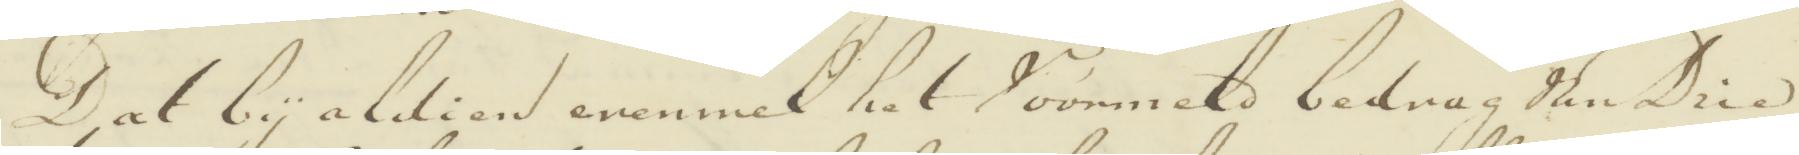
Dat bij aldien evenwel het Voormeld bedrag van Drie
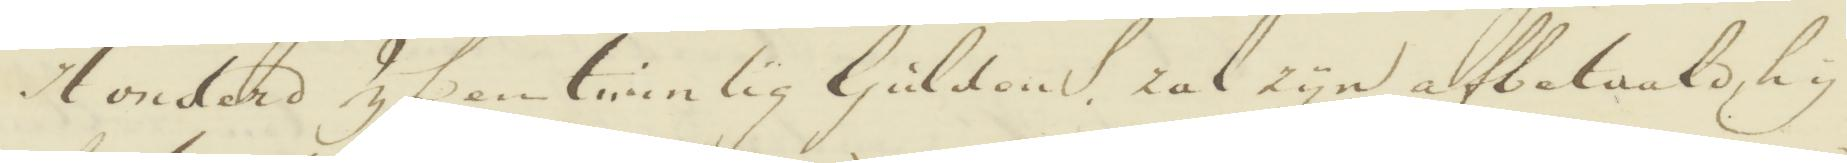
Honderd Vyf en twintig Guldens, zal zijn afbetaald hij
